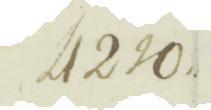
ƒ4220„
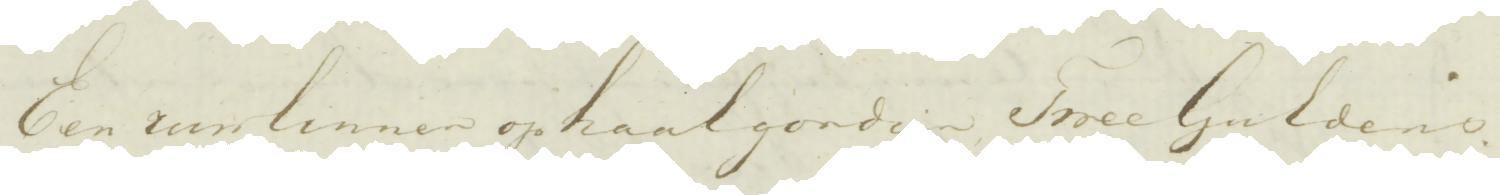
Een ruw linnen ophaalgordijn, Twee Guldens.
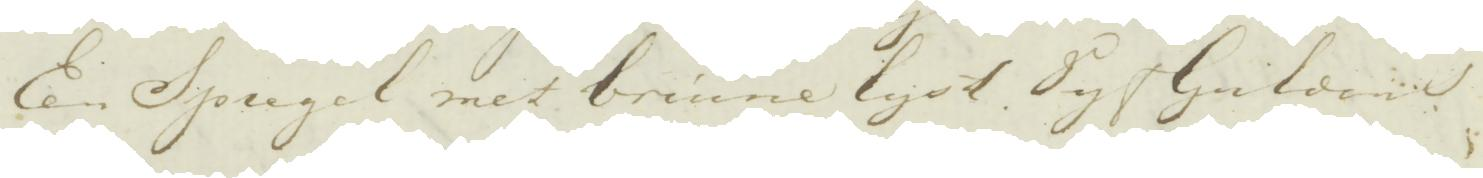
Een Spiegel met bruine lijst Vyf Guldens
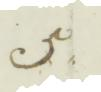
5„
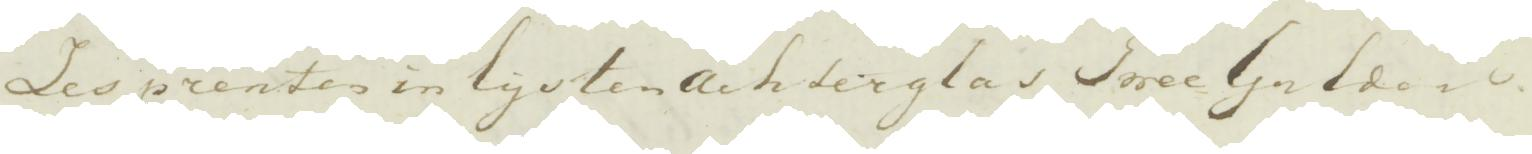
Zes prenten in lijsten achter glas, Twee Guldens.
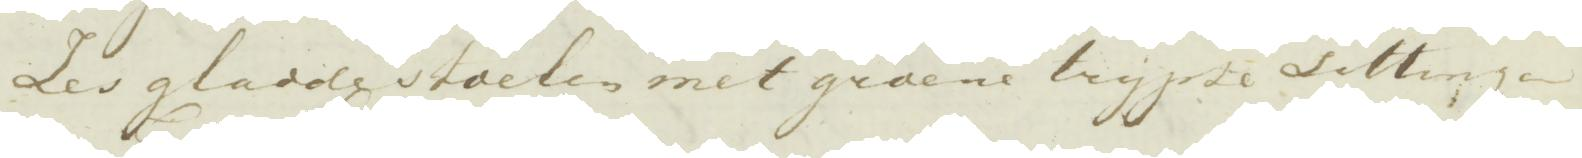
Zes gladde stoelen met groene trijpte sittinge
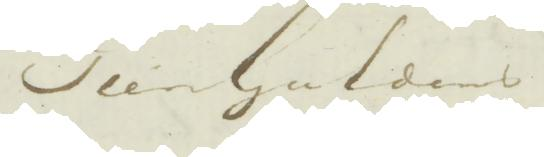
Tien Guldens
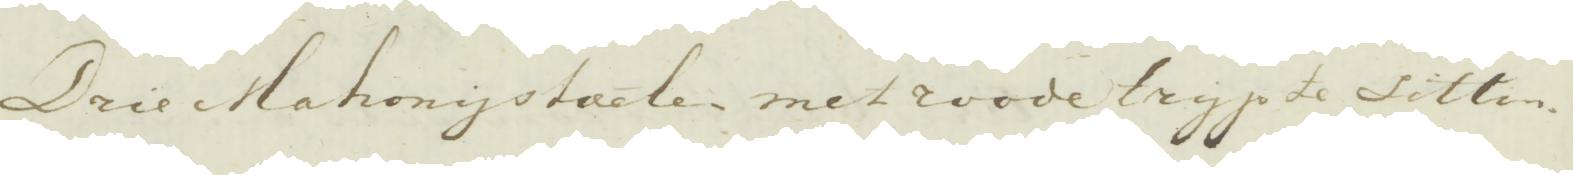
Drie Mahonijstoelen met roode trijpte sittin.
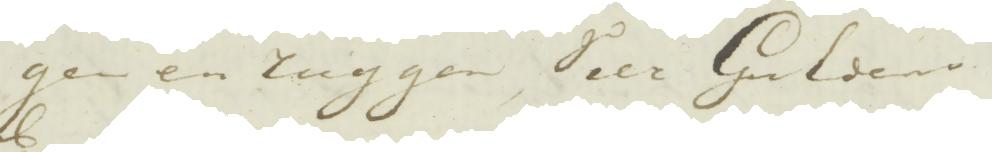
gen en ruygen, Vier Guldens
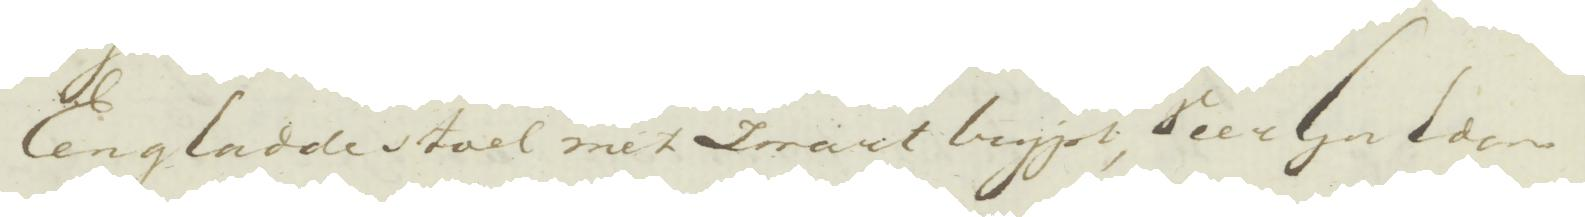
Een gladde stoel met zwart trijpt, Vier Gulden
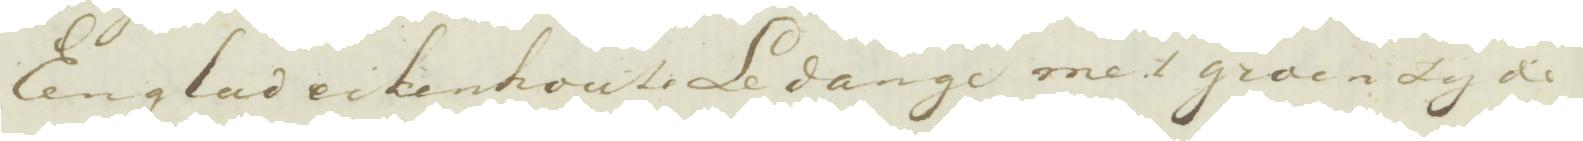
Een glad eikenhoute Ledange met groen zyde
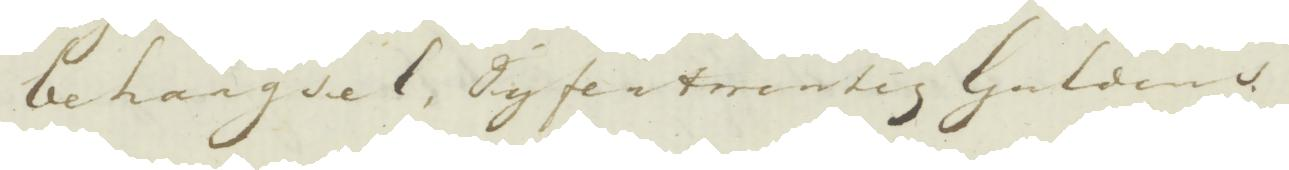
behangsel , Vyfentwintig Guldens.
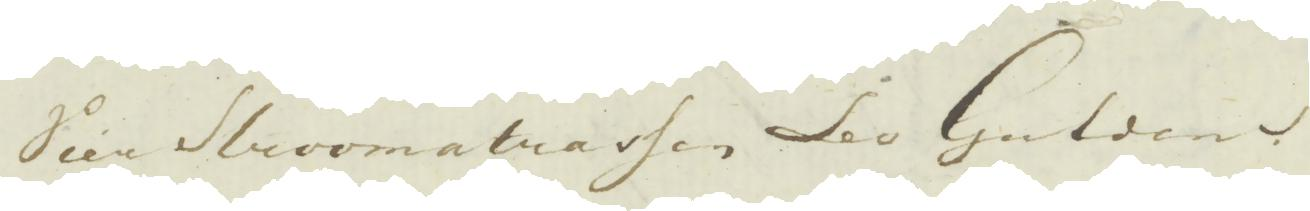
Vier stroomatlassen ses Guldens
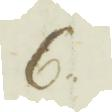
6„
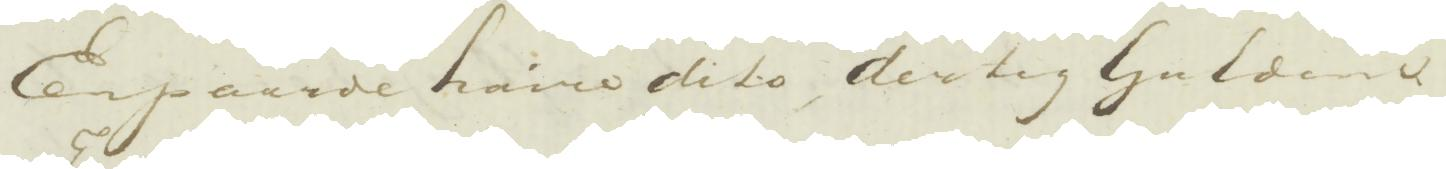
Een paarde haire dito, dertig Guldens.
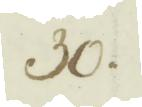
30„
